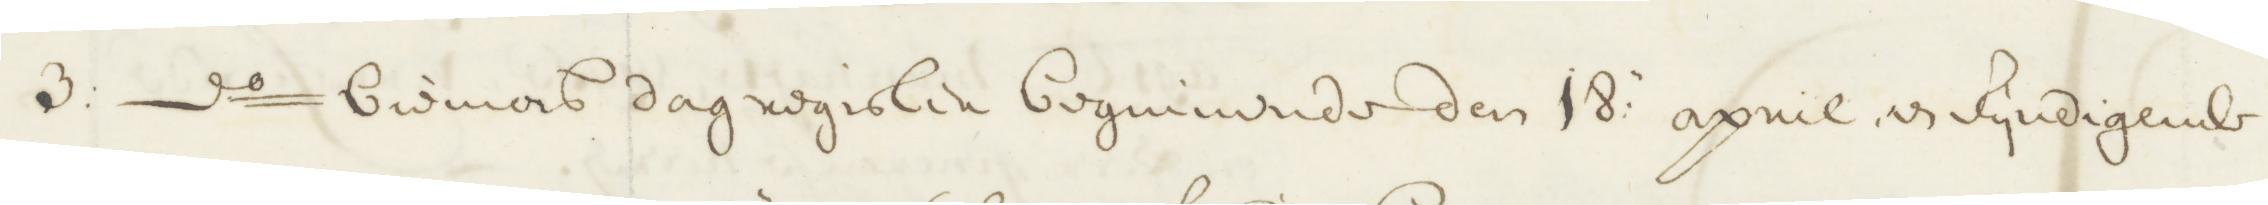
3: d=o biemas dag register beginnende den 18: april, en Eijndigende
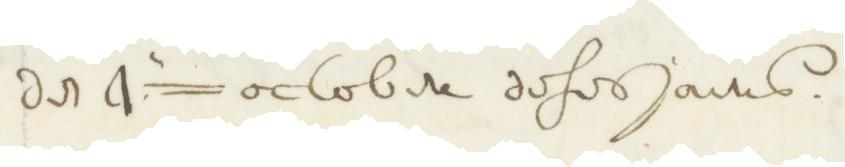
den 4=' october deses Jaers.
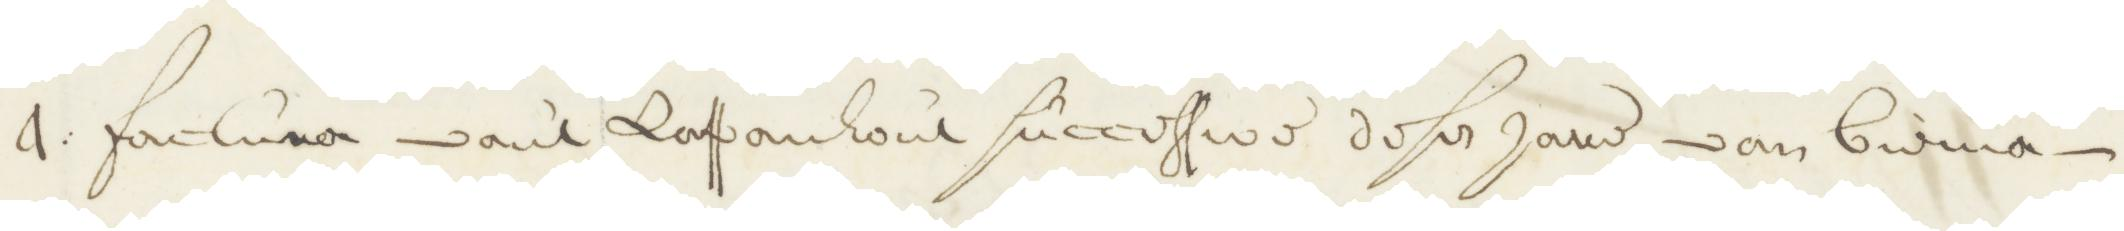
4: factura van ’t Zappanhout Successive dese Jare van biema—
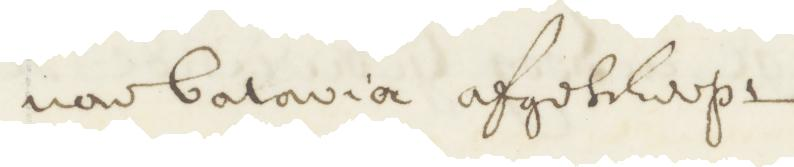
nae batavia afgescheept
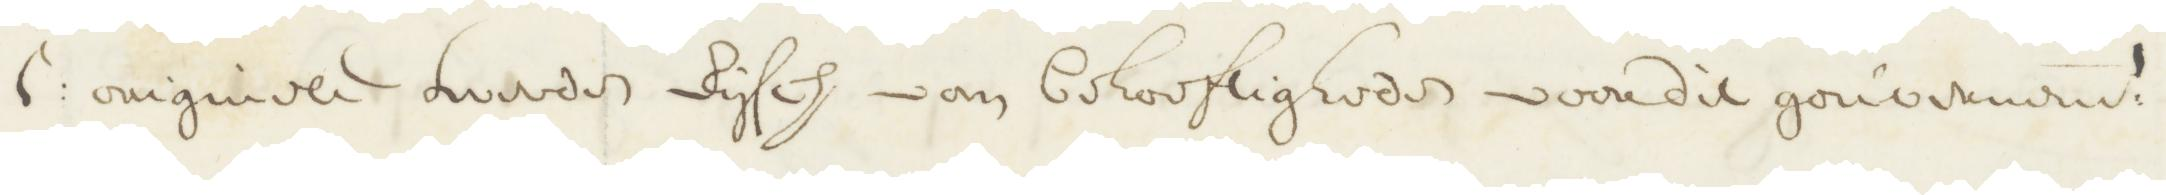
5: originele tweeden Eijsch van behoeftigheden voor dit gouvernem:t
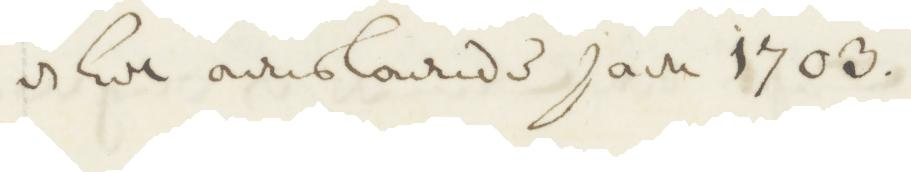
en het aenstaende Jaer 1703.
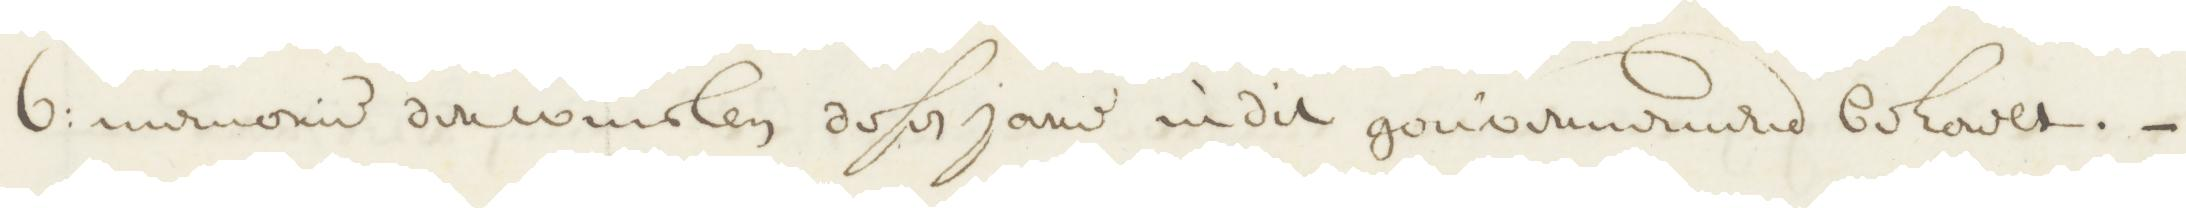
6: memorie derwinsten desen jare in dit gouvernemend behaelt.—
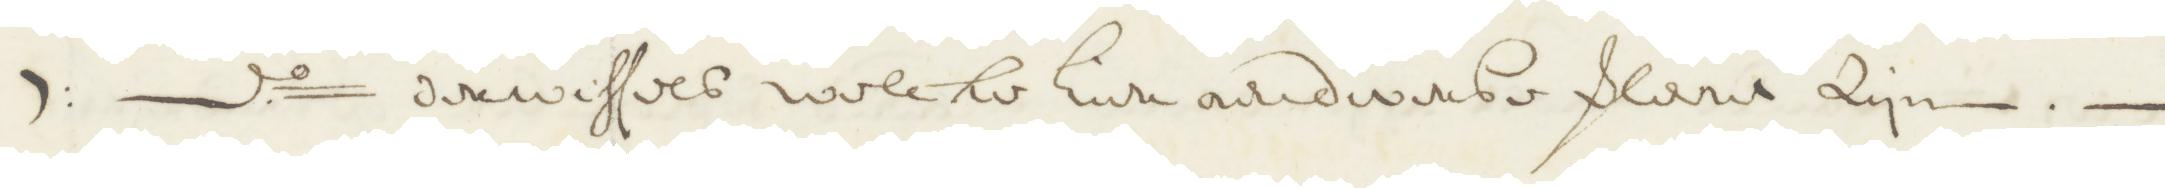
7: d=o derwissels welcke hier aen diverse verleent Zijn .—
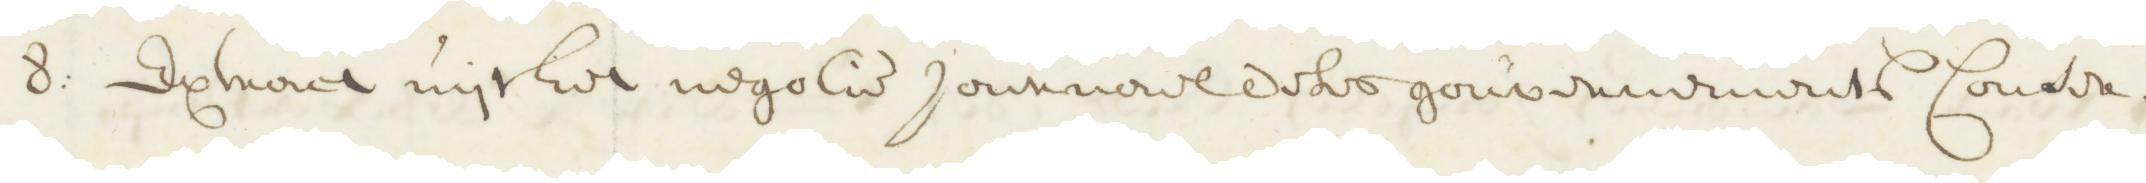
8: Extract uijt het negotie Journael deses gouvernements Conser
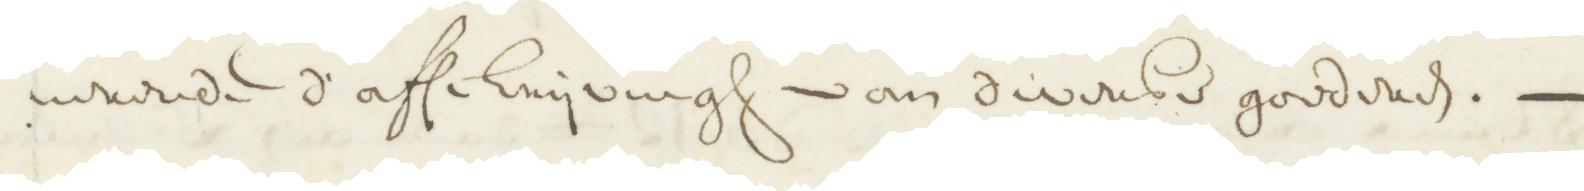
nerende d’ afschrijvingh van diverse goederen.—
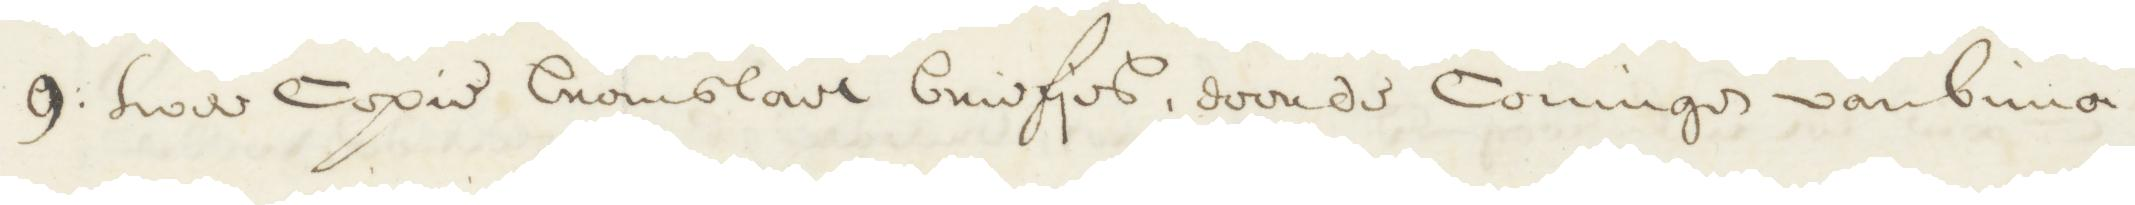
9: twee Copie translaet briefjes, door de Coningen van bima
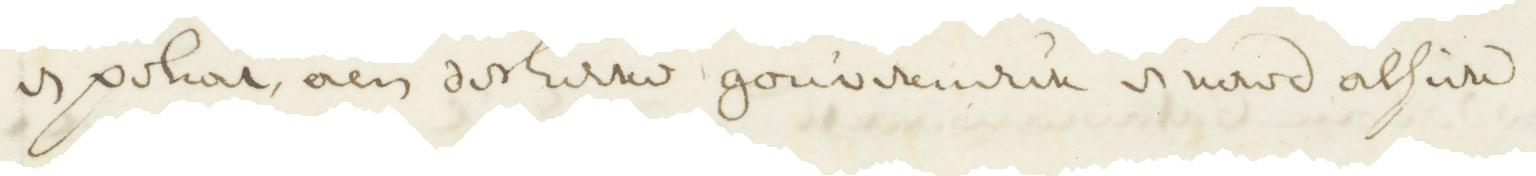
en pekat, aen den heere gouverneur en raed alhier
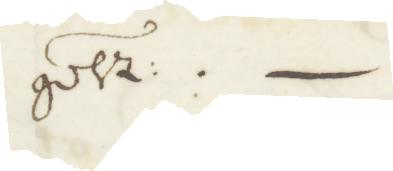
gesz: . —
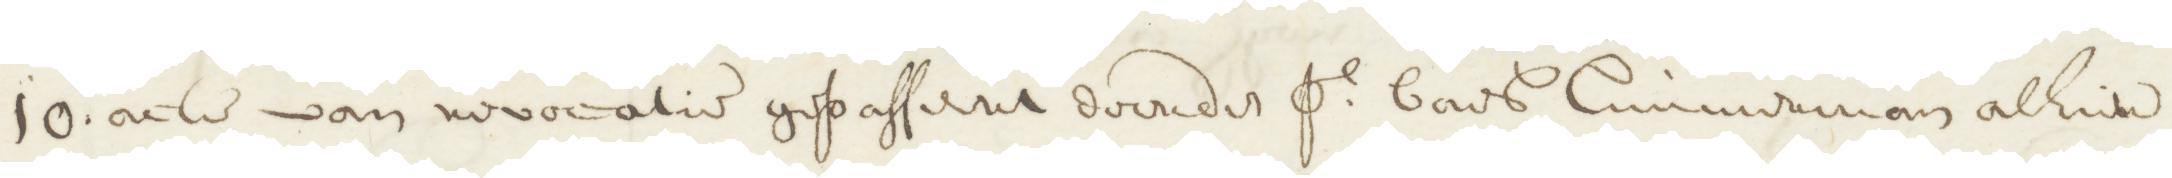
10. acte van revocatie gepasseert doorden p:l baes timmerman alhier
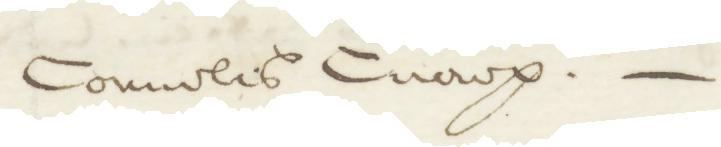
Connelis Cnaep . —
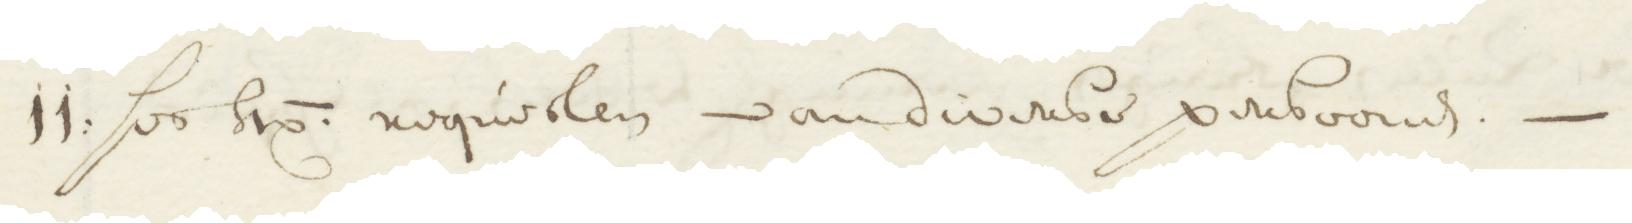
11: ses stx: requesten van diverse persoonen. —
